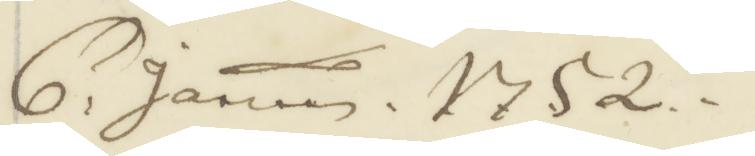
6:' Jann. 1752. .
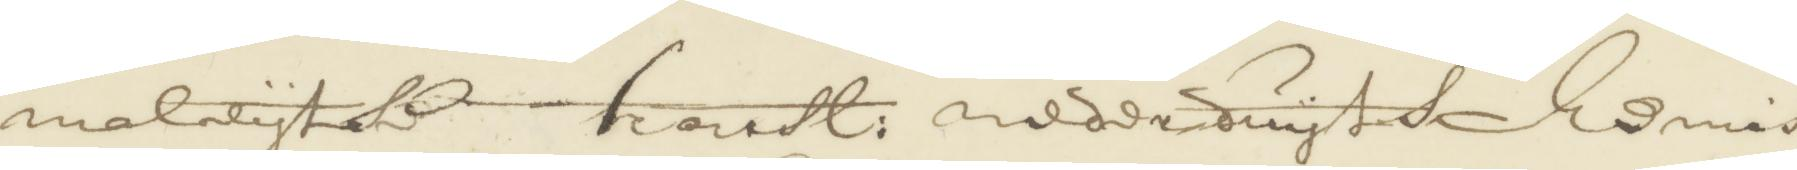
maleijtse transl: nederduijtsche mis
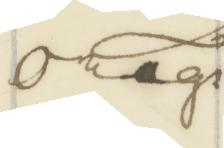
orig:
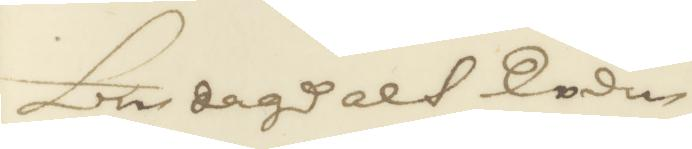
ten dage als Even
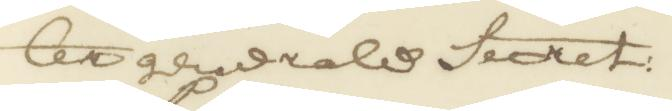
ter generale secret:
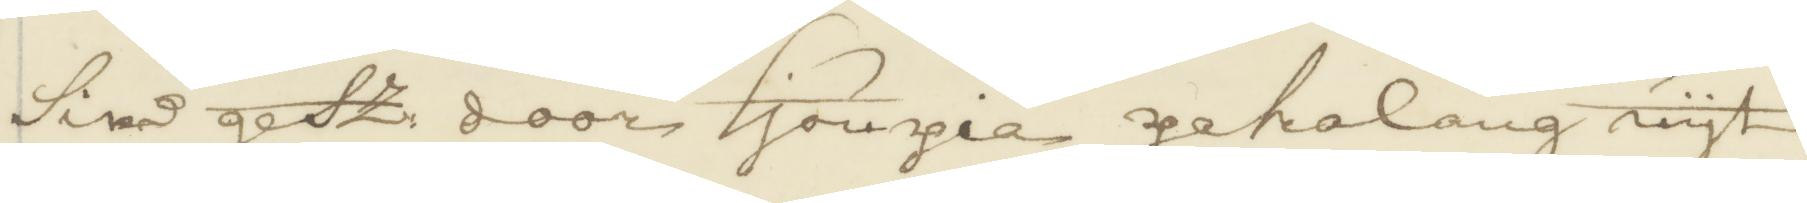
sive gesz: door tjoupia pakalang uijt
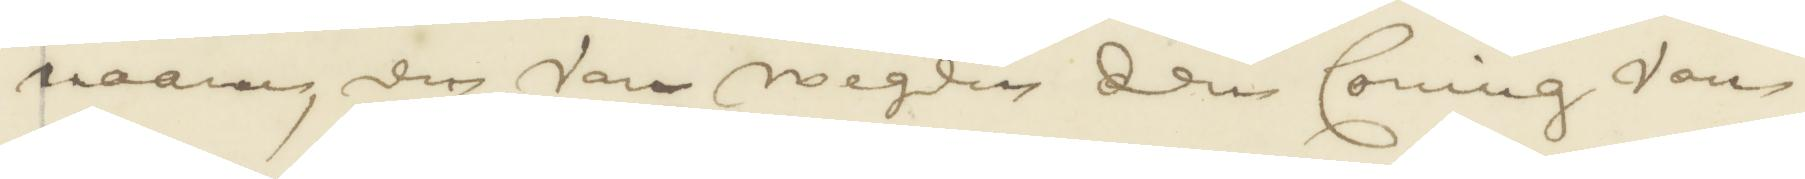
naam, en van wegen den Coning van
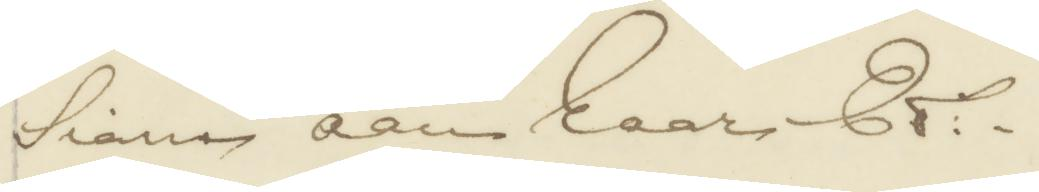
siam aan haar Ed:s .
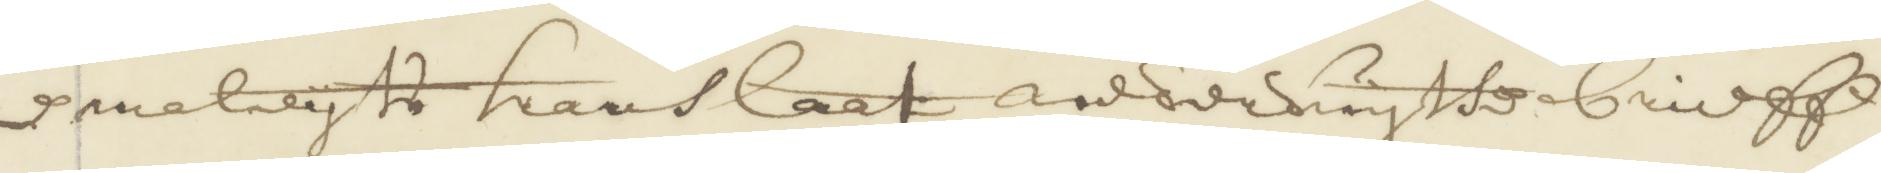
_.o maleijts translaat nederduijtse brieff
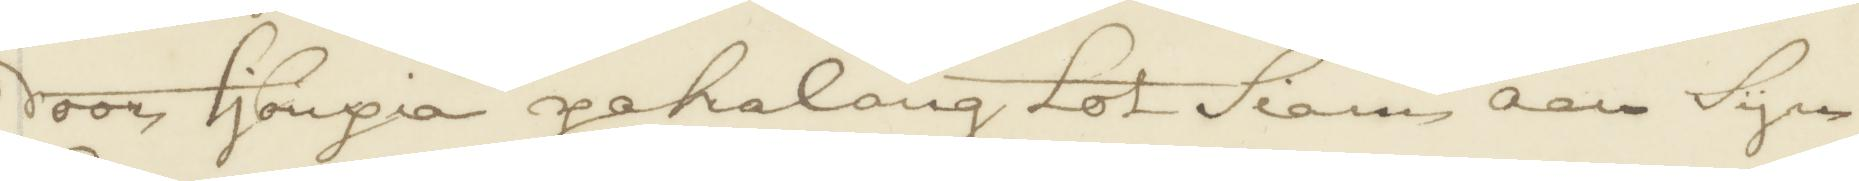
door tjoupia pakalang tot siam aan sijn
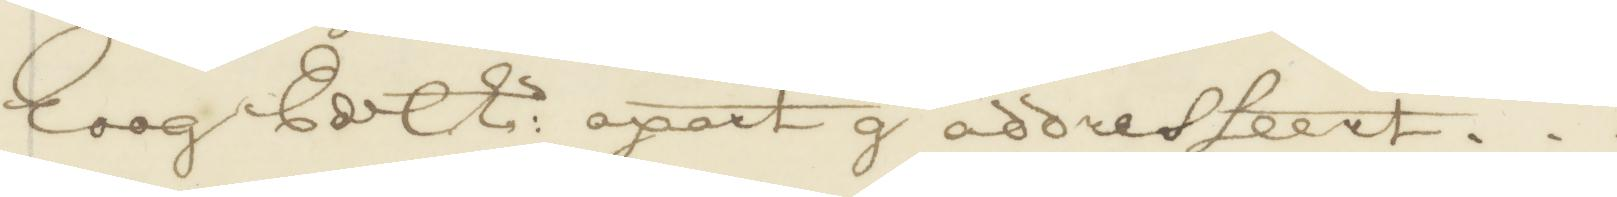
hoog Edelh:d apart g’addresseert . .
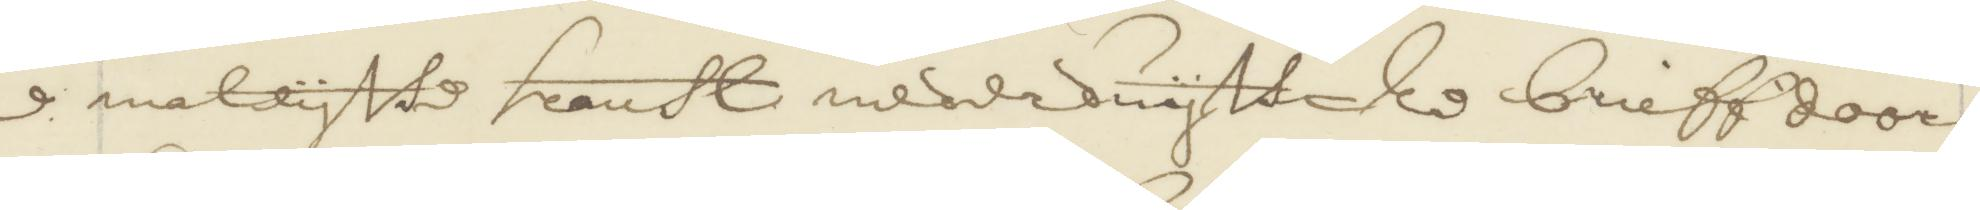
_.o maleijtse trasl. nederduijtsche brieff door
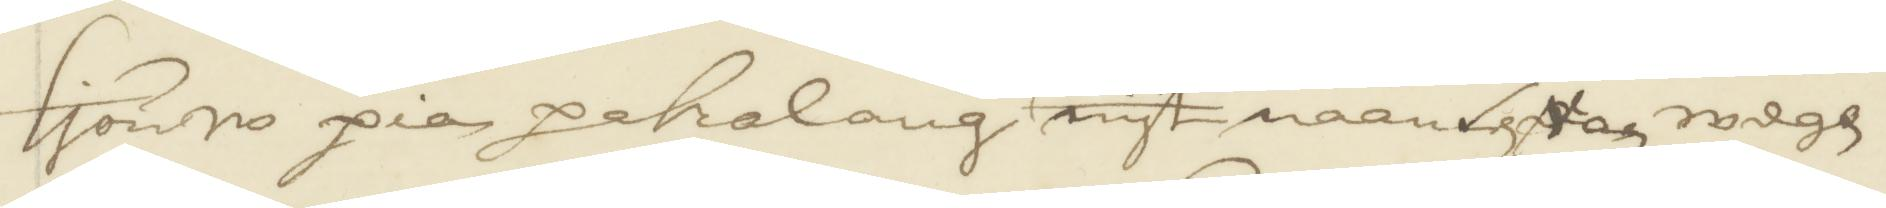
tjouw pia pakalang uijt naam van wegen
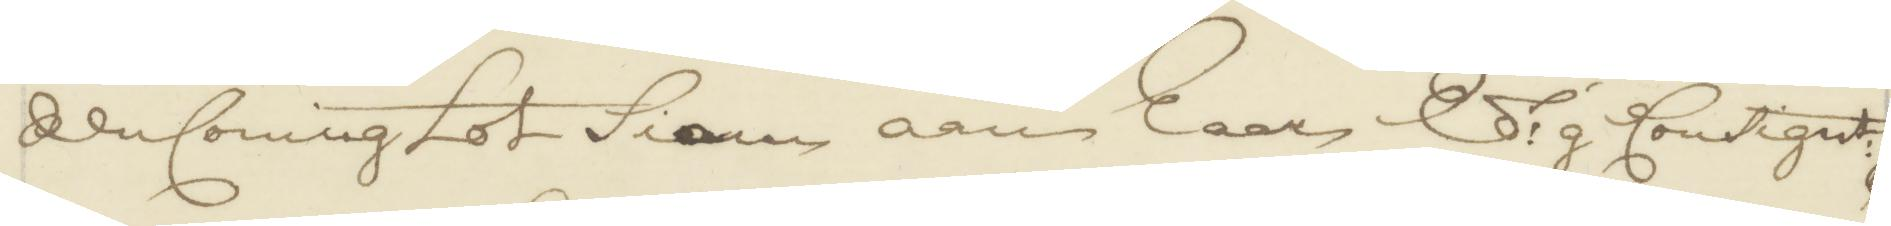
den Coning tot siam aan haar Ed:s g Consign:t
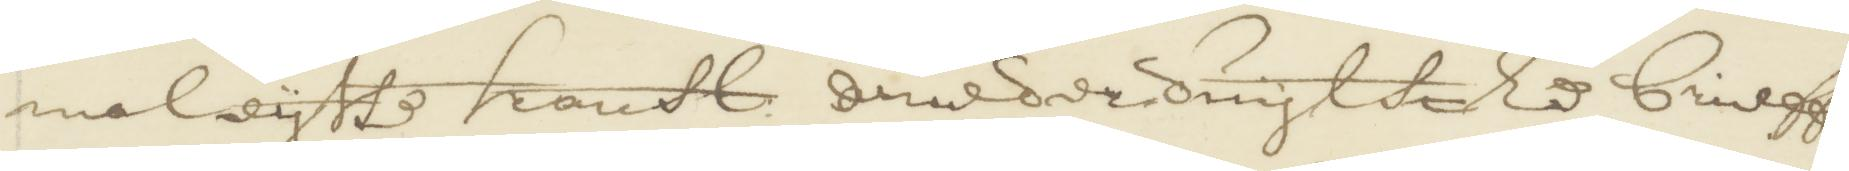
maleijtse transl. de nederduijtsche brieff
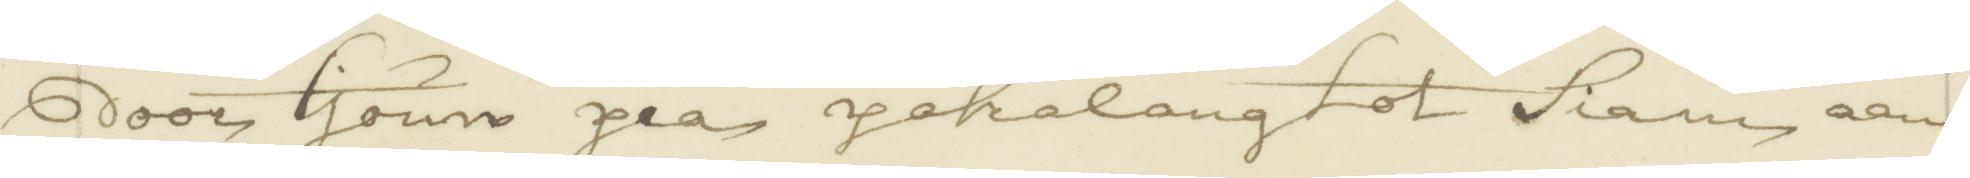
door tjouw pia pakalang tot siam aan
